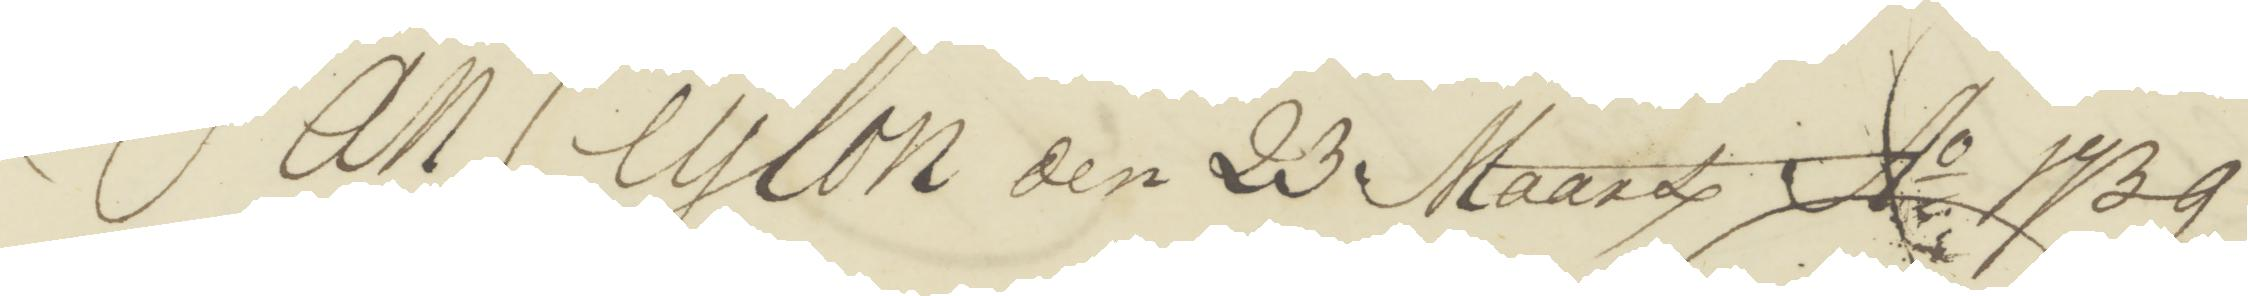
Van Ceijlon den 23 Maart A=o 1739
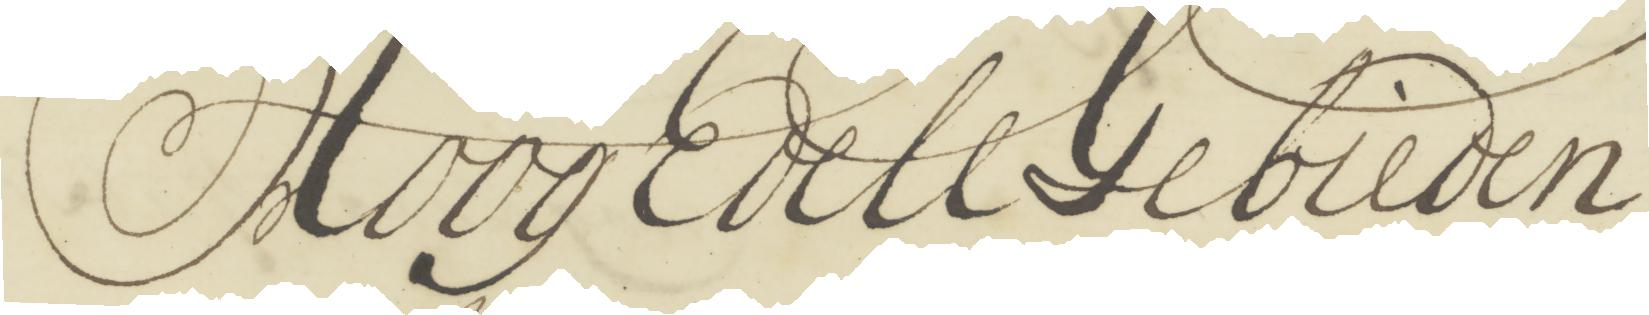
Hoog Edele Gebieden
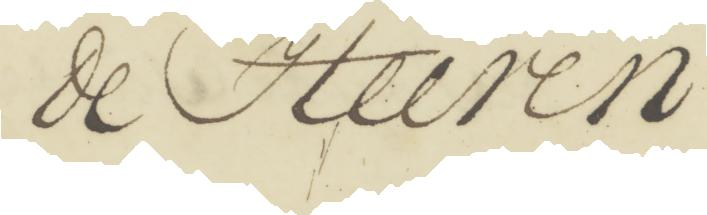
de Heeren
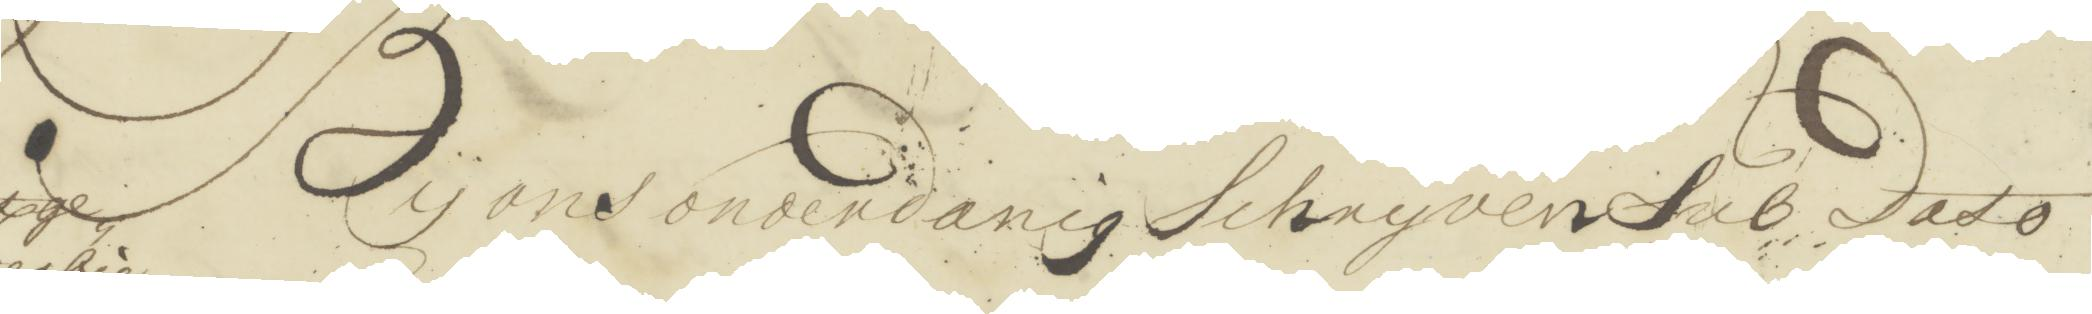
Bij ons onderdanig schrijven sub Dato
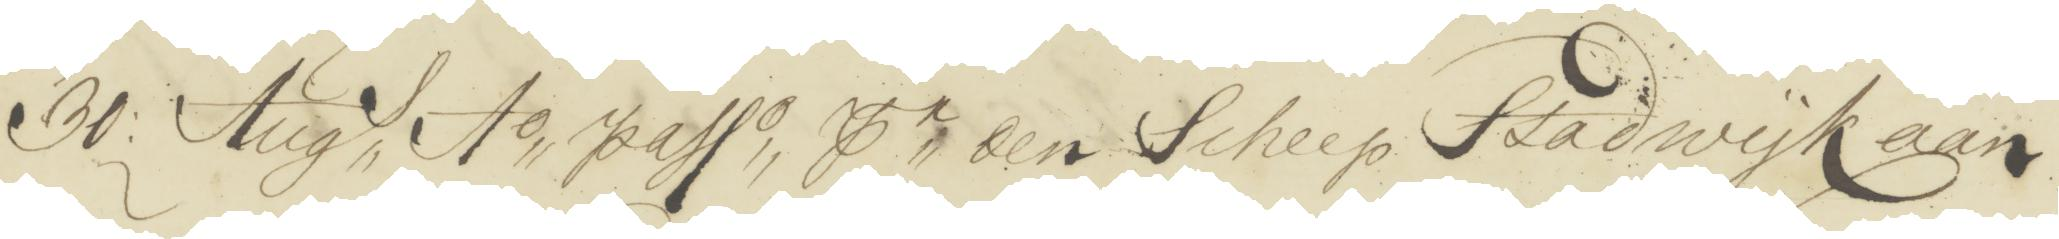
30: Aug„s A„o pass„o p„r den scheep stadwijk aan
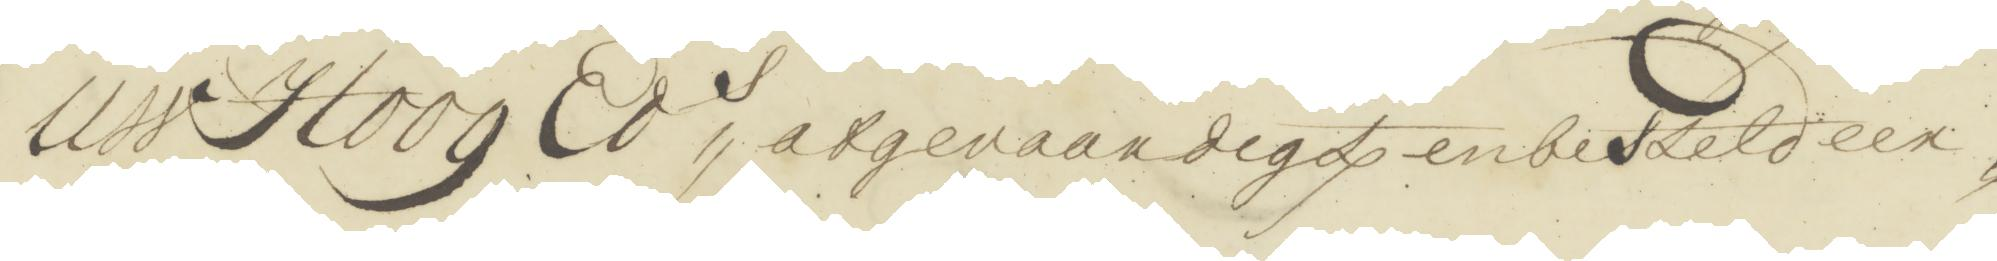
UW Hoog Ed„s afgevaardigt en besteld eer
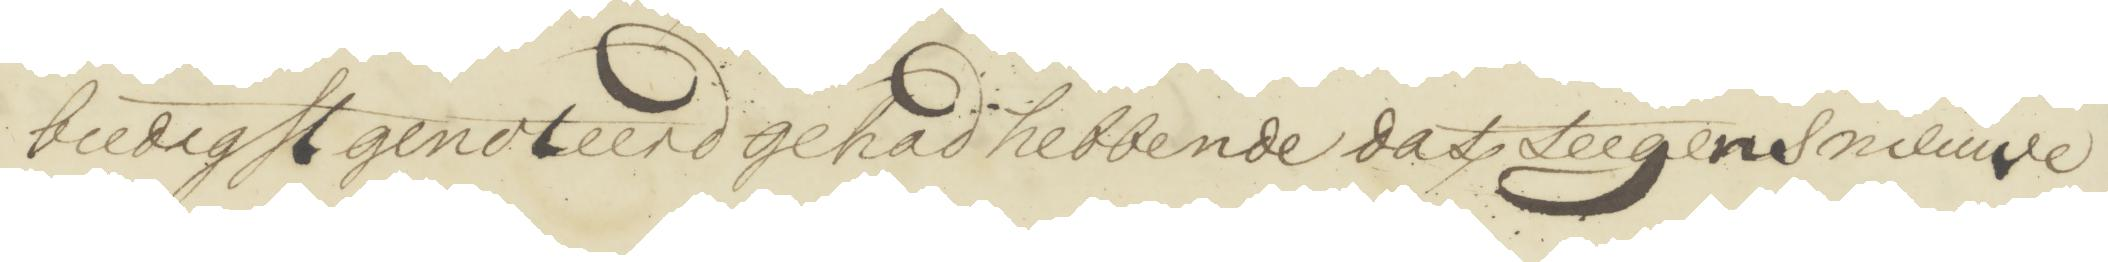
biedigst genoteerd gehad hebbende dat teegens nieuwe
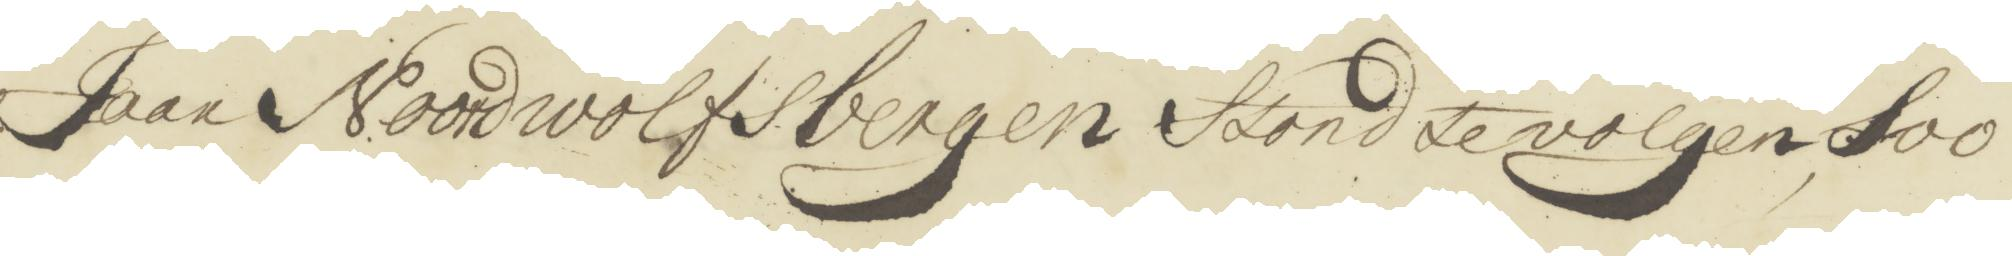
Jaar Noordwolfsbergen stond te volgen, soo
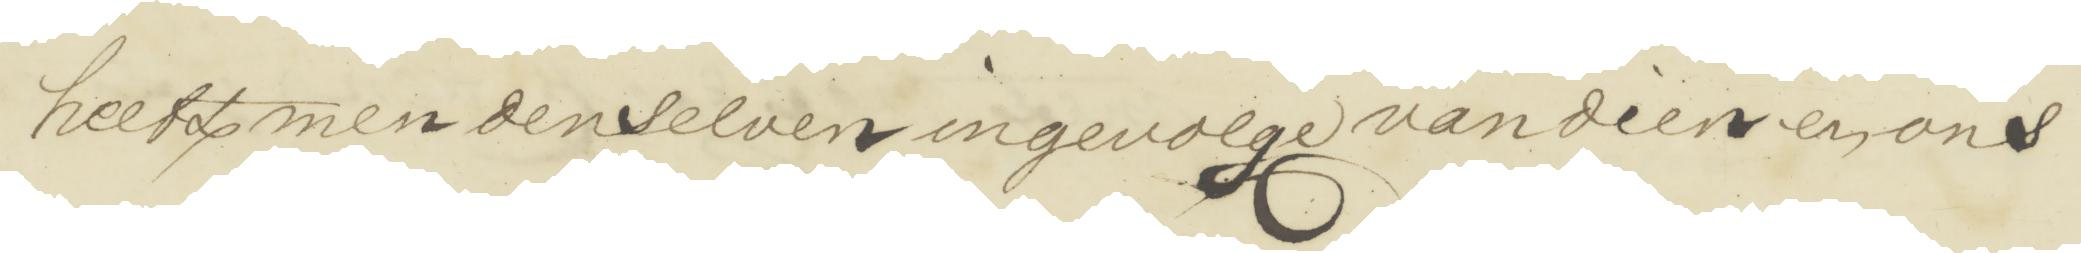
heeft men denselven ingevolge van dien en ons
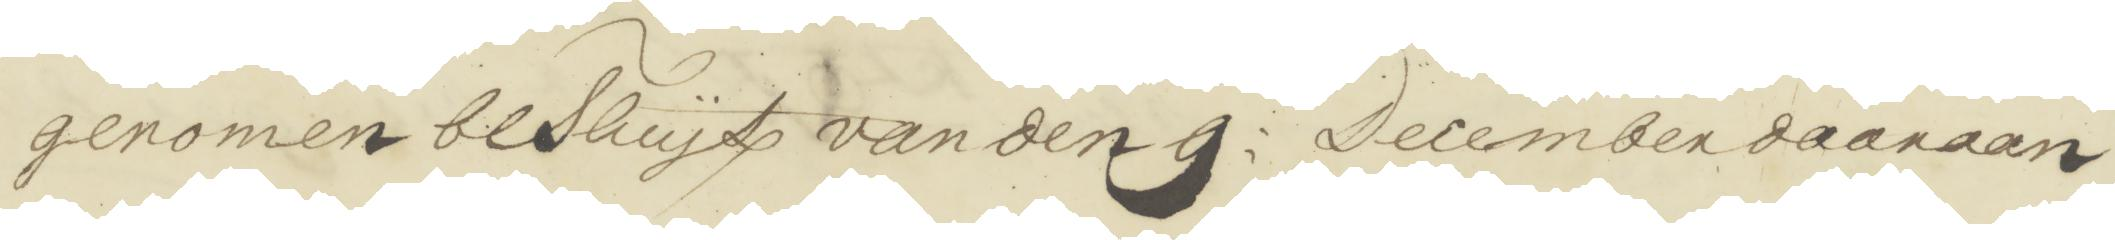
genomen besluijt van den 9: December daaraan
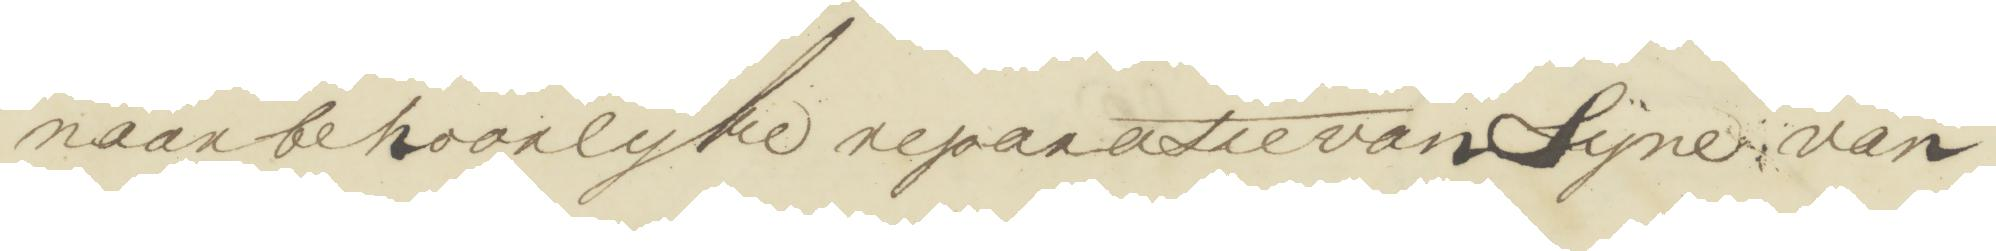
naar behoorlijke reparatie van sijne van
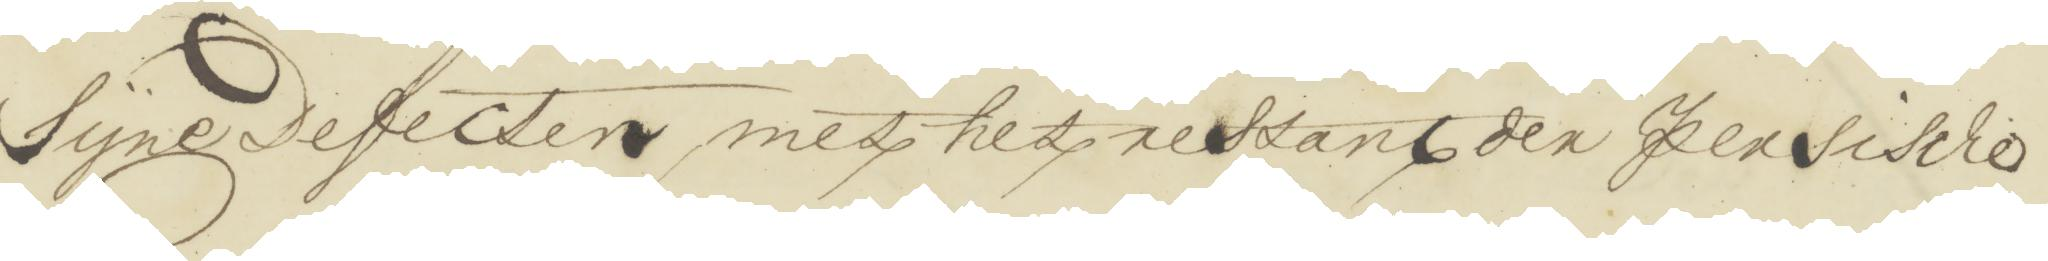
sijne Defecten, met het restant der Persische
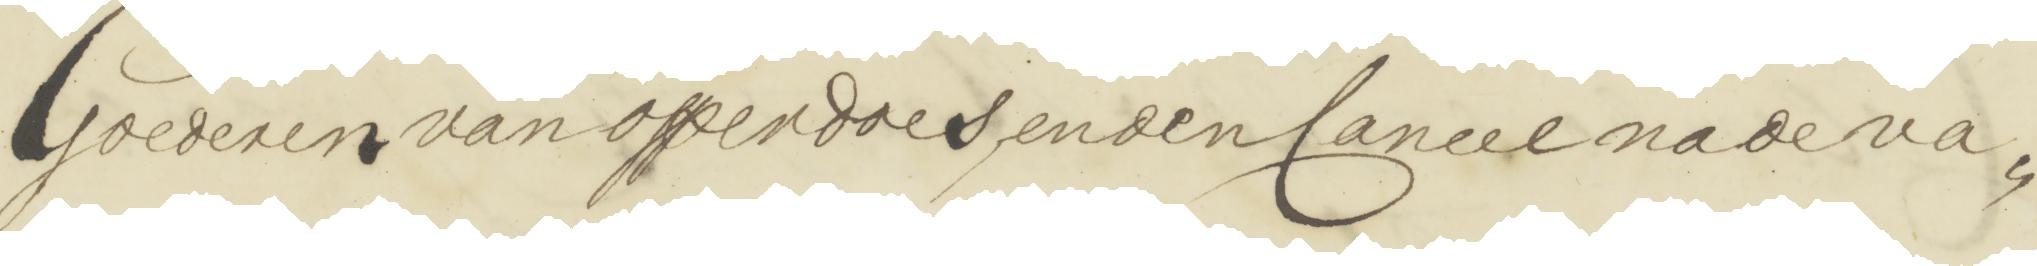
Goederen van opperdoes, enden Caneel nade va„
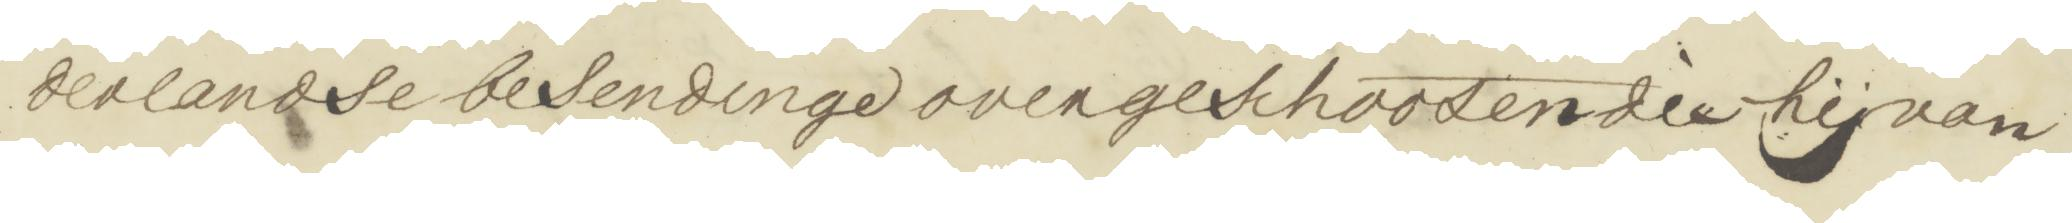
derlandse besendinge overgeschooten die hij van
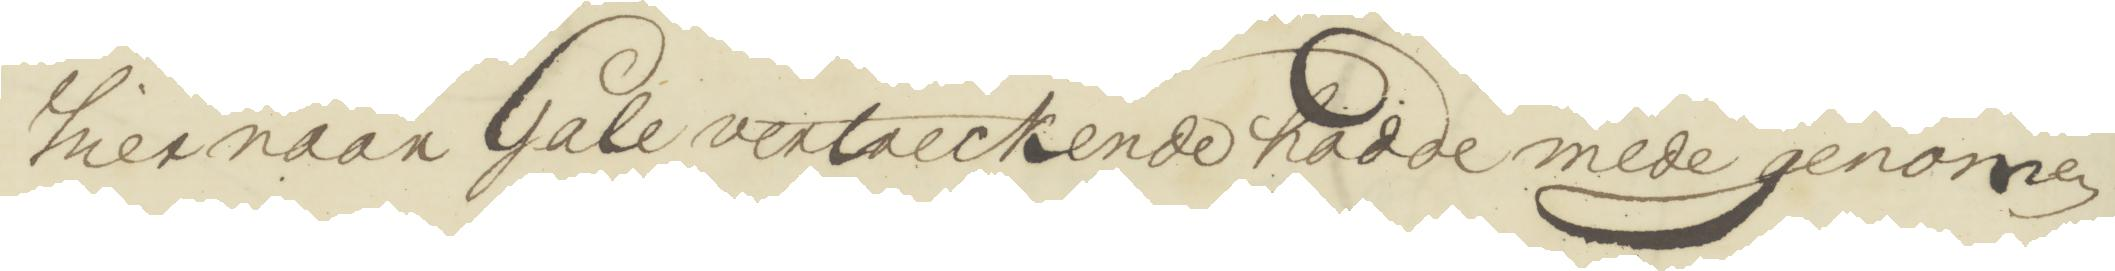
hier naar Gale vertreckende hadde mede genomen,
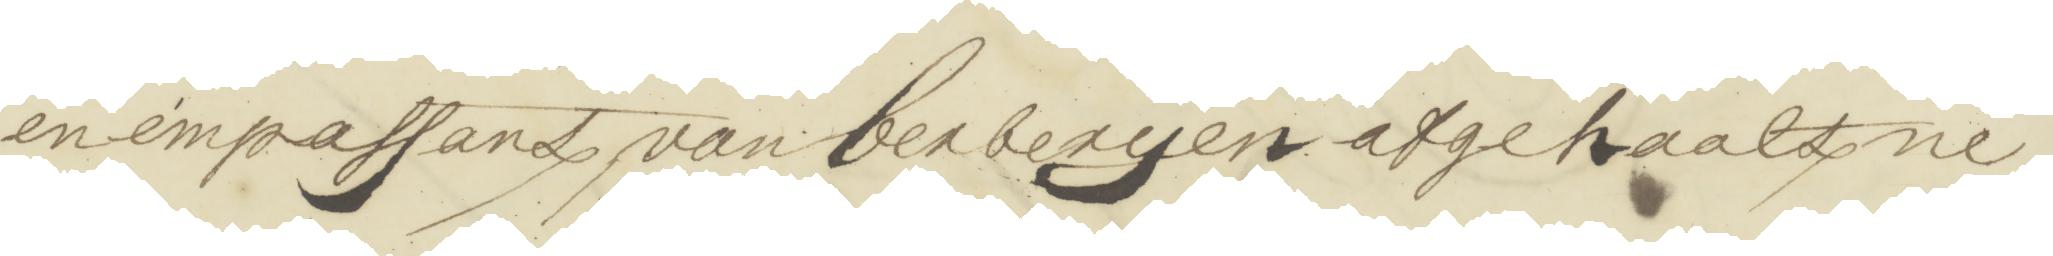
en empassant, van berberijen afgehaalt ne
